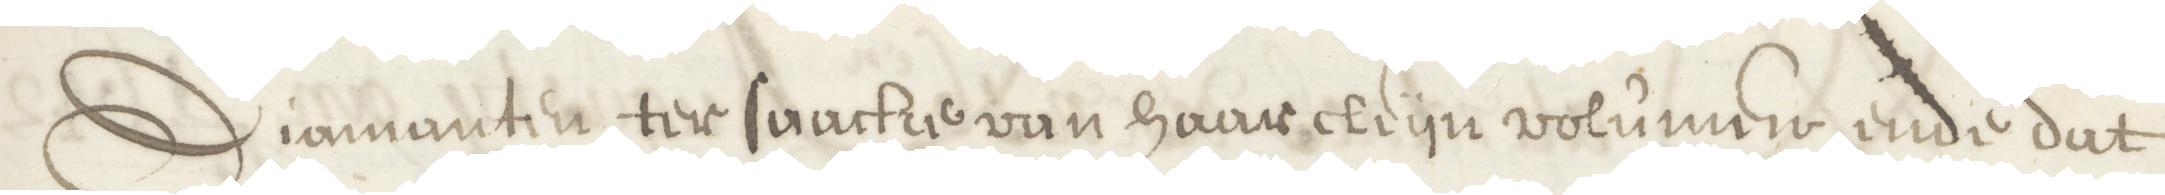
Diamanten ter saacke van haar cleijn volumen ende dat
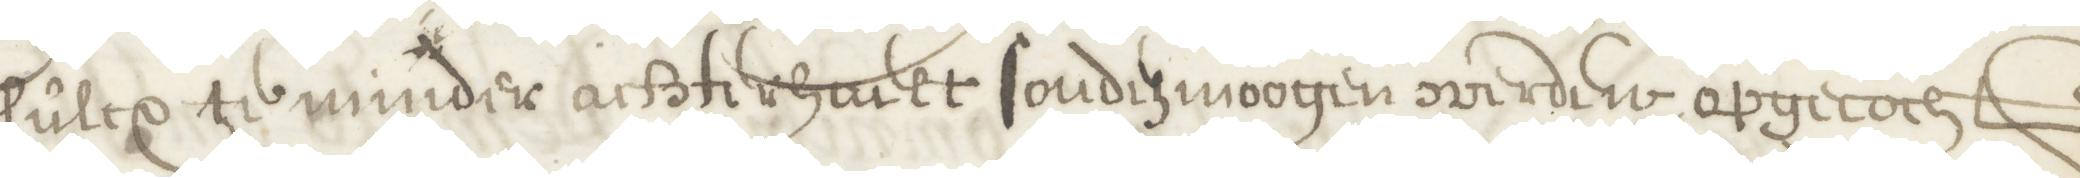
sulcx te minder achterhaelt souden moogen werden opgecocht
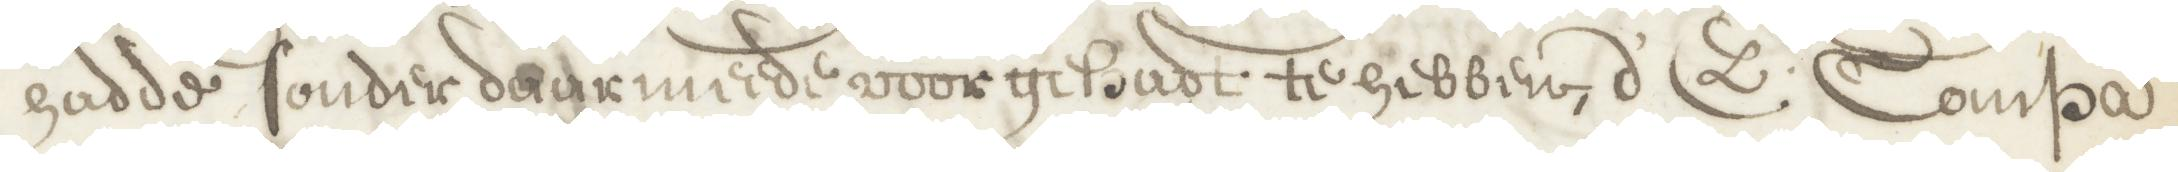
hadde sonder daarmeede voor gehadt te hebben, d’ E: Compa:e
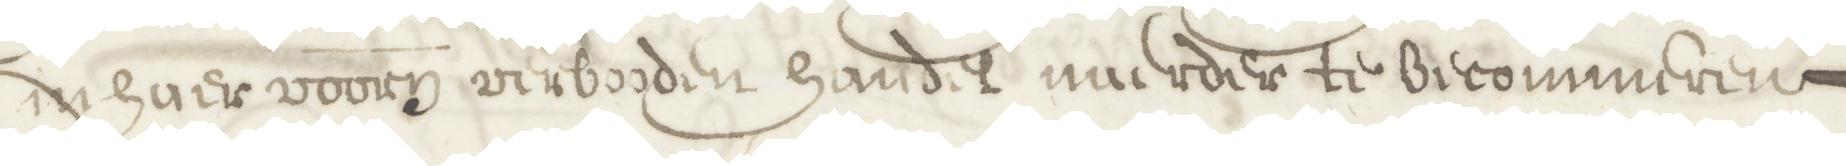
in haer voorn verbooden handel naerder te becommeren
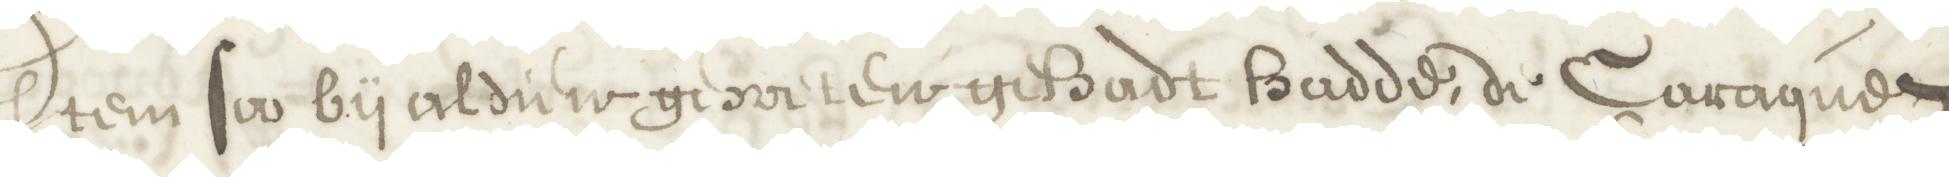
Jtem soo bij aldien geweten gehadt hadde, de Caraque
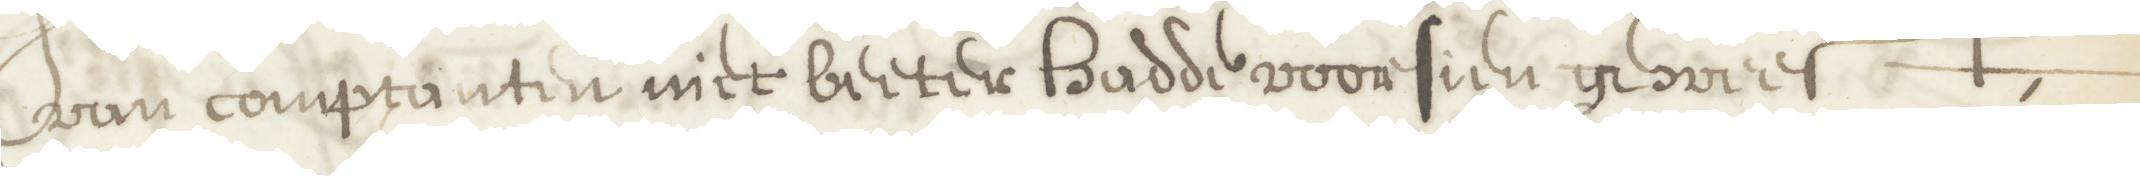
van comptanten niet beeter hadde voorsien geweest,
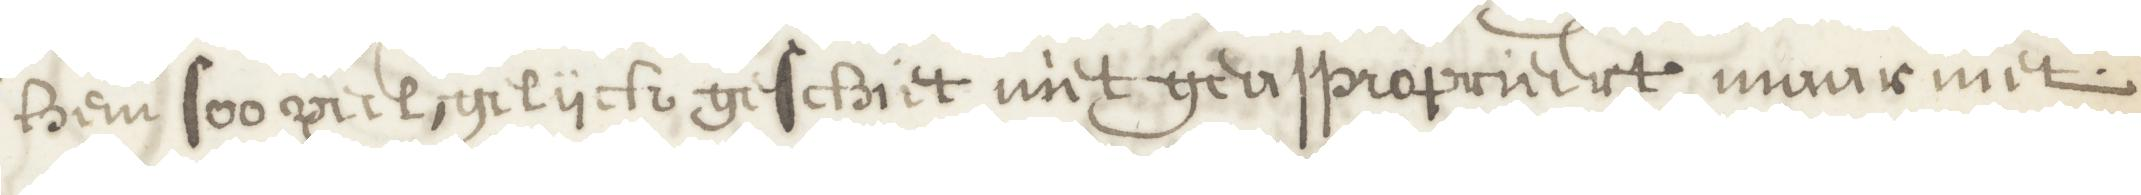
hem soo veel, gelijck geschiet niet geapproprieert maar met
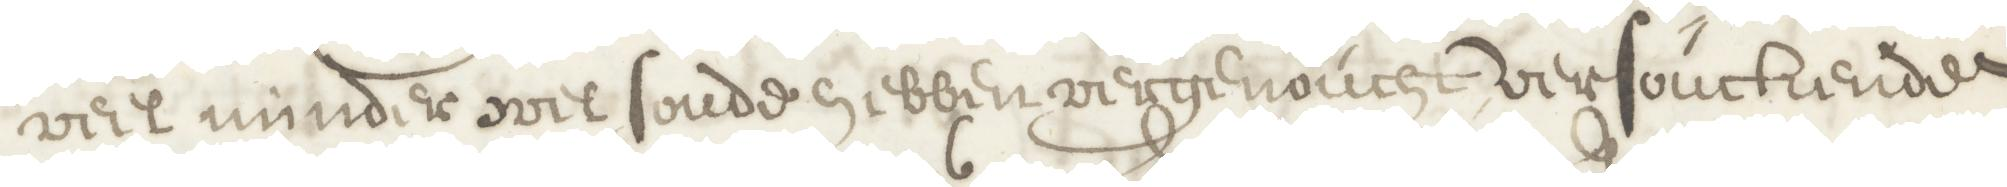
veel minder wel soude hebben vergenougt, versouckende
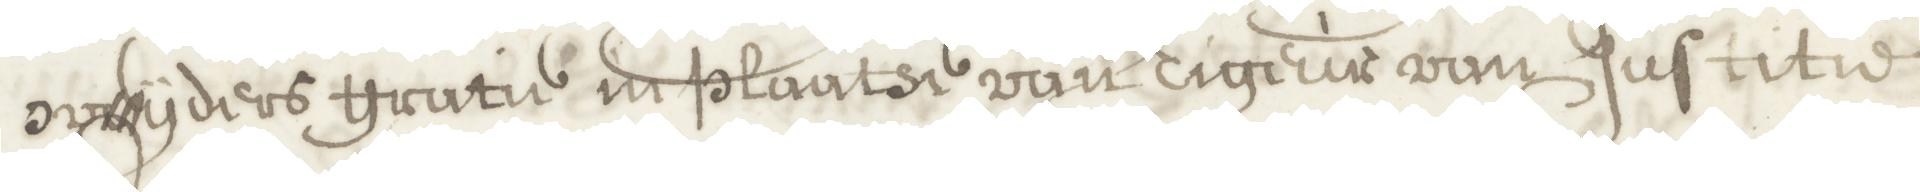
wijders gratie in plaatse van rigeur van Justitie
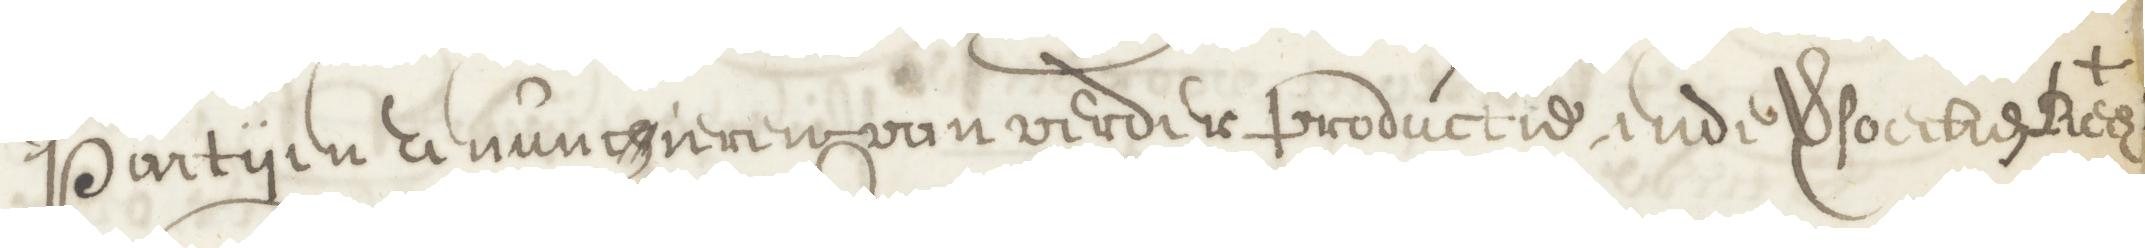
Partijen renuncieren van verder productie, ende versoecken Rech:t
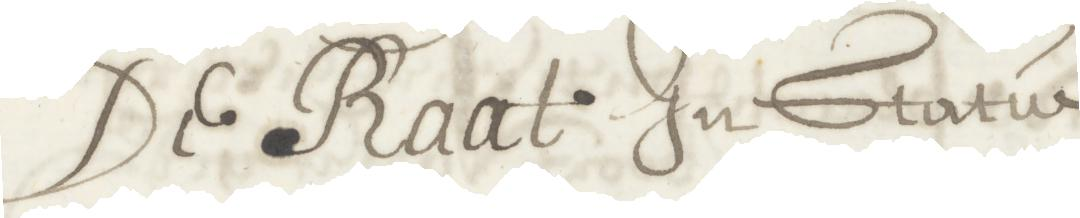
De Raat Jn Statu
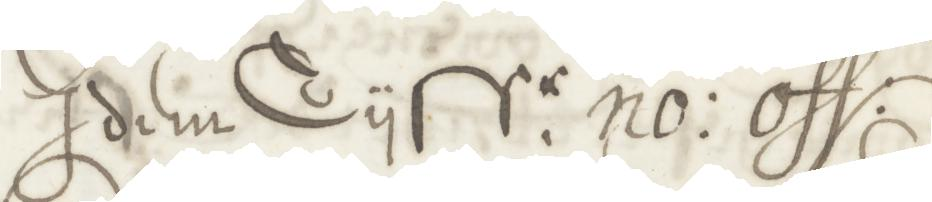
Jdem Eijss:r no: off:
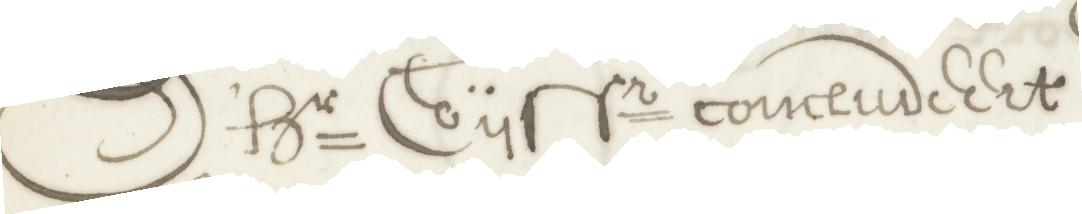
D' H=r Eijss=r concludeert
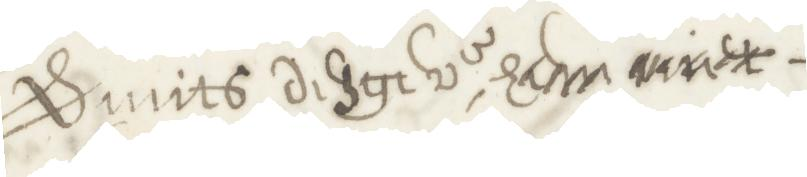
vermits den gev:e hem niet
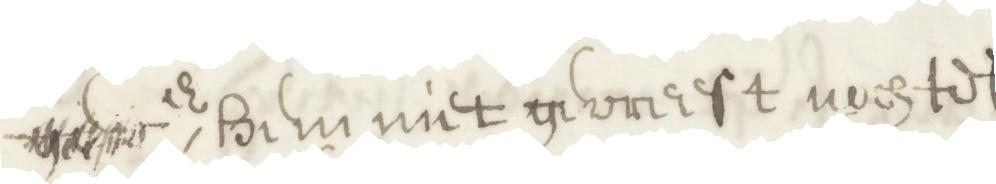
gere:ch hem niet gevreest noch te
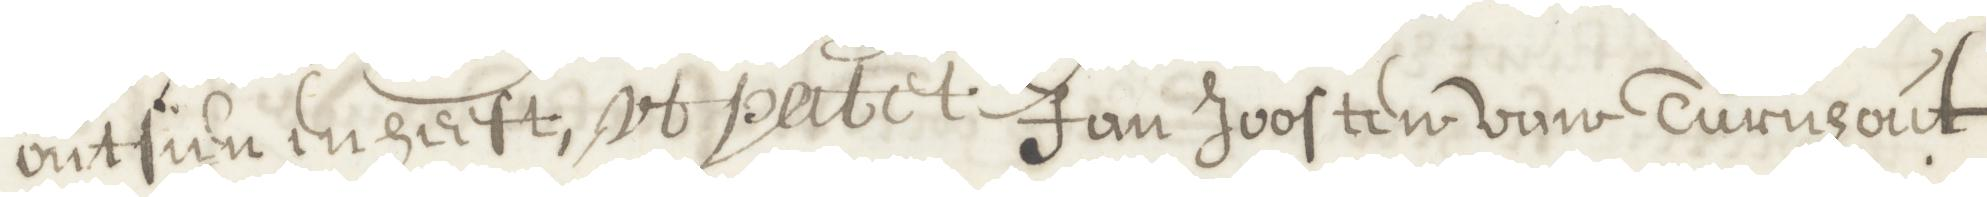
ontsien en heeft, vt patet Jan Joosten van Turnhout
